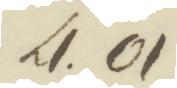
4.01
